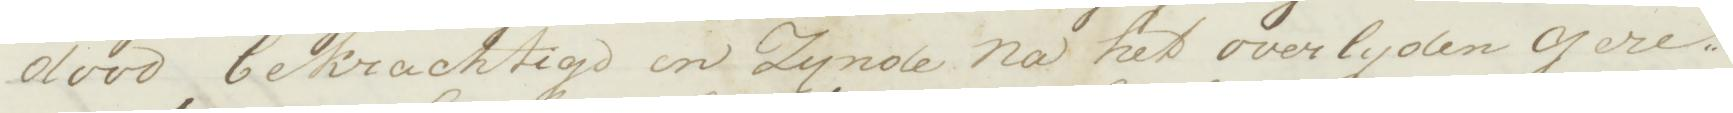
dood bekrachtigd en zynde na het overlyden gere„
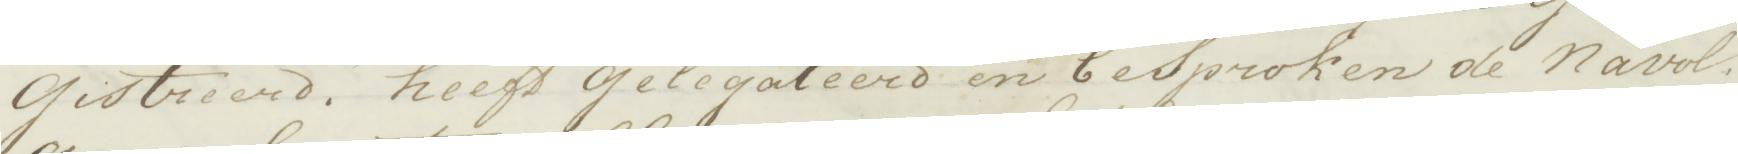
gistreerd, heeft gelegateerd en besproken de Navol„
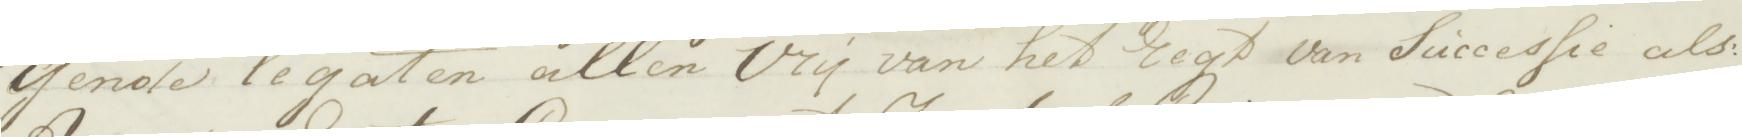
gende legaten allen Vrij van het regt van successie als:
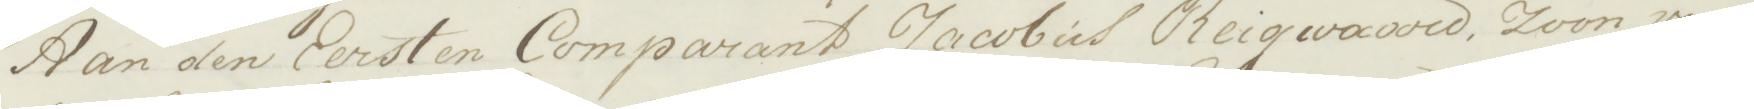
Aan den Eersten Comparant Jacobus Reigwaard, zoon van
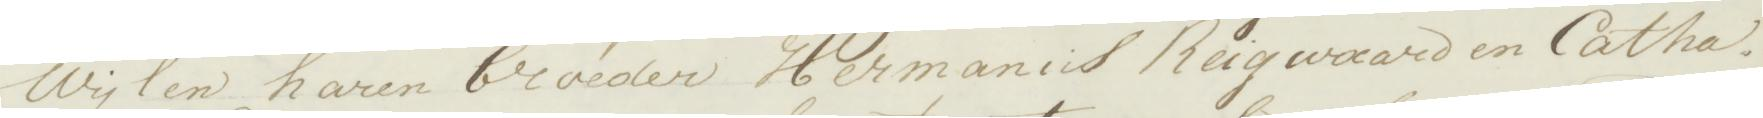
wijlen haren broeder Hermanus Reigwaard en Catha„
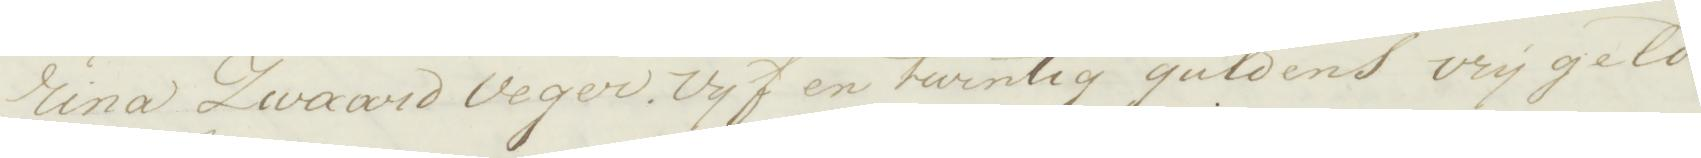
rina Zwaard veger, vyf en twintig guldens vrij geld
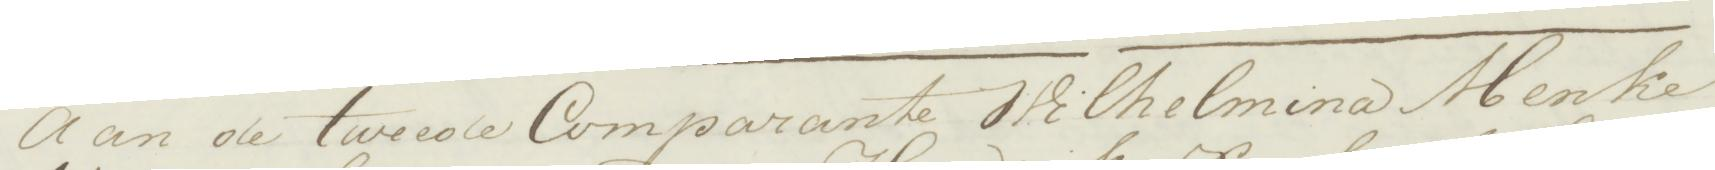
Aan de tweede Comparante Wilhelmina Menke
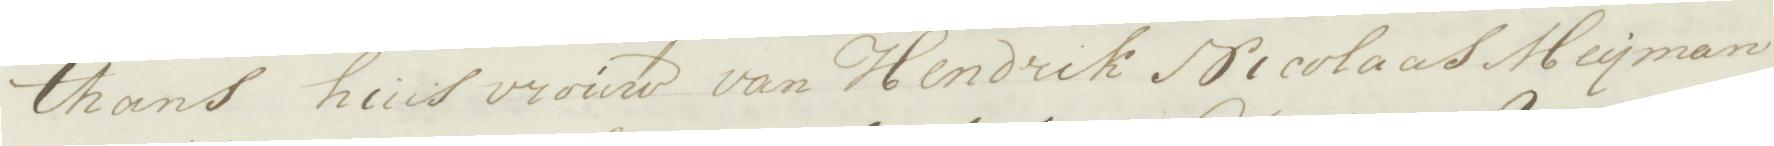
thans huisvrouw van Hendrik Nicolaas Meijman
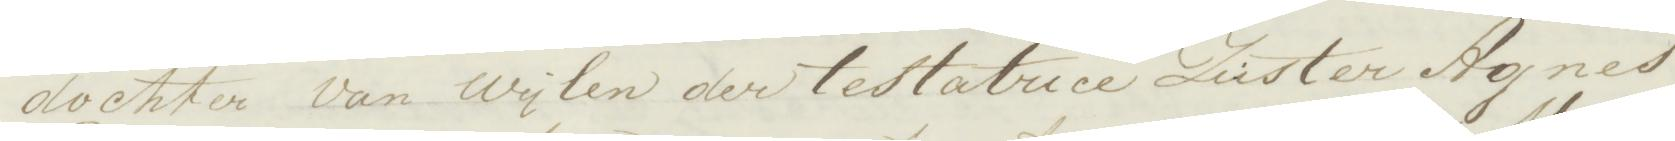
dochter van wijlen der testatrice Zuster Agnes
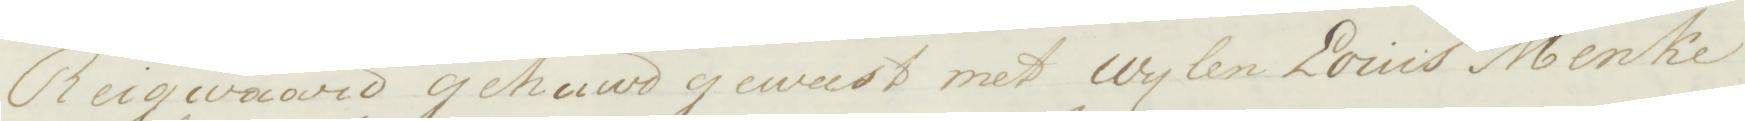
Reigwaard gehuwd geweest met wylen Louis Menke
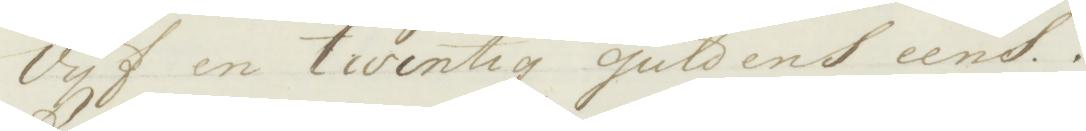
Vyf en twintig guldens eens.
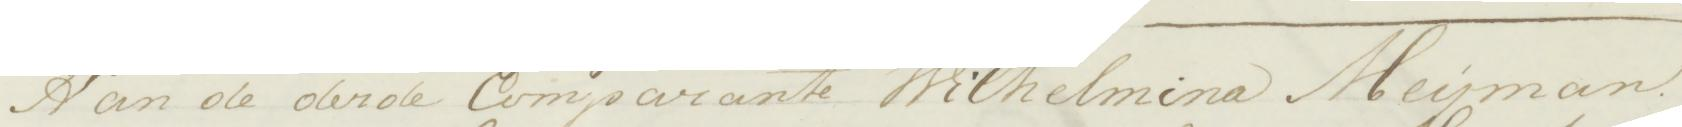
Aan de derde Comparante Wilhelmina Meijman
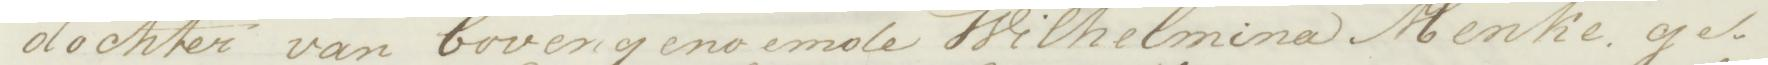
dochter van bovengenoemde Wilhelmina Menke, ge
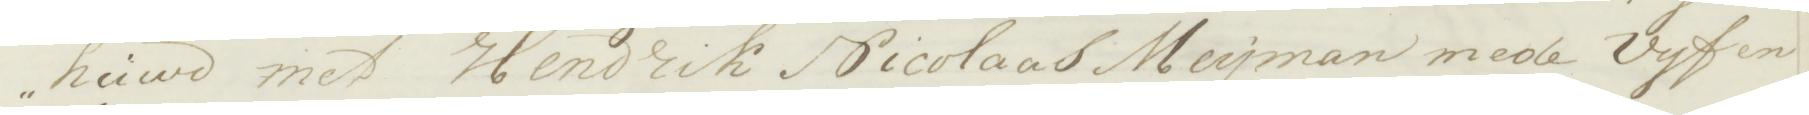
„huwd met Hendrik Nicolaas Meijman mede Vyf en
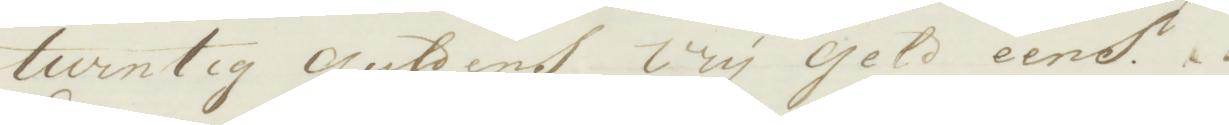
twintig guldens vrij geld eens.
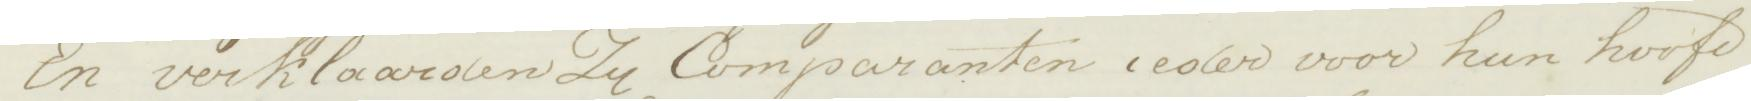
En verklaarden Zy Comparanten ieder voor hun hoofd
